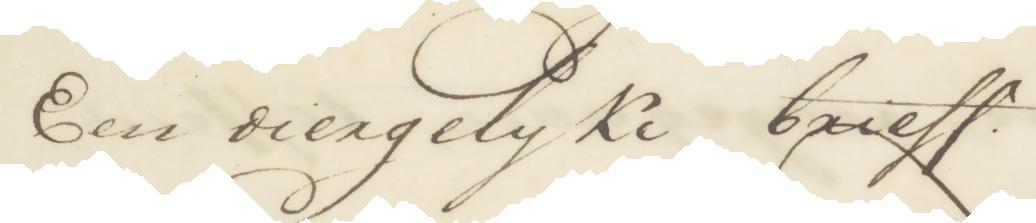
Een diergelyke brieff.
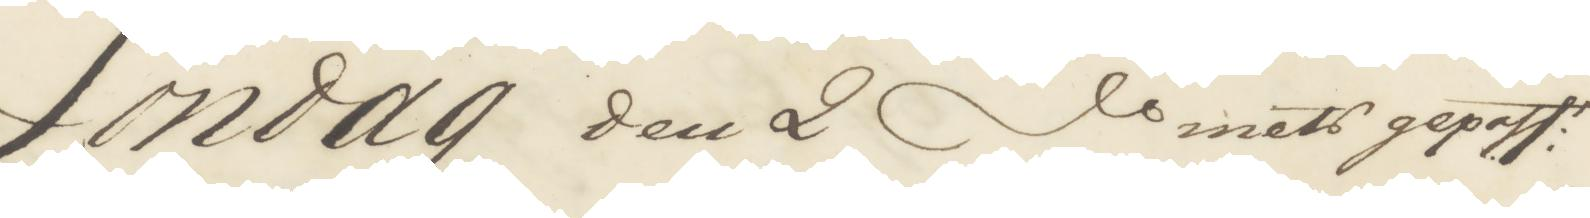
Sondag den 2 d:o niets gepass:t
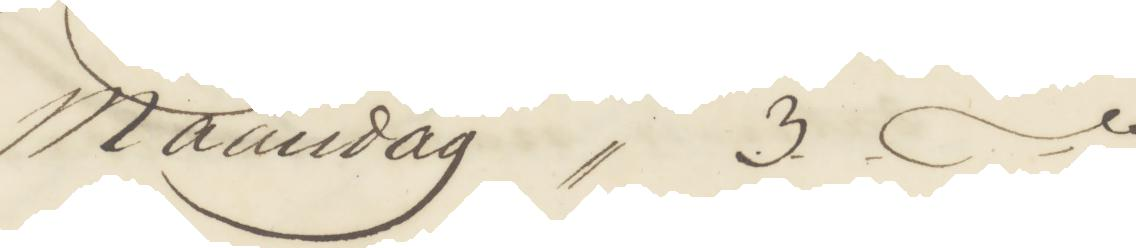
Maandag „ 3 do
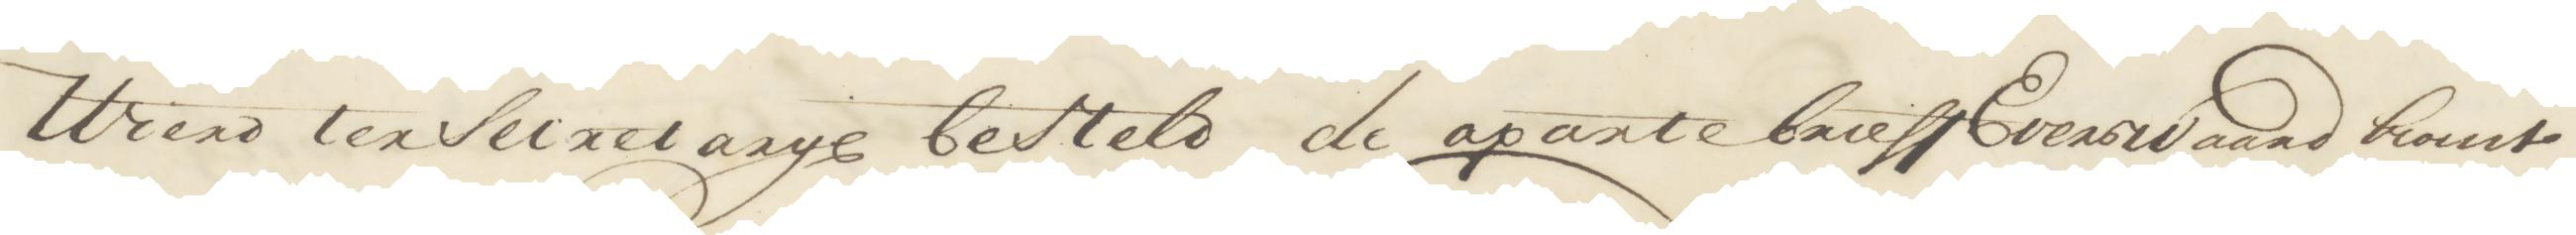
Wierd ter Secretarye besteld de aparte brieff Everswaard komt
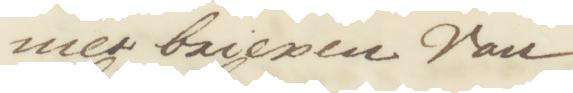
met brieven van
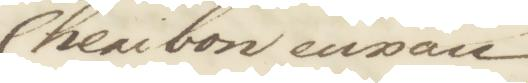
heribon en van
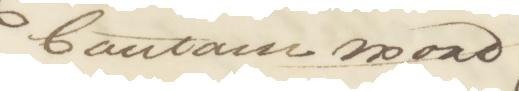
bantam word
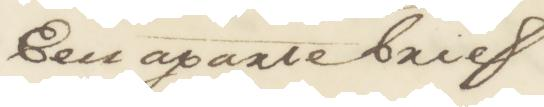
Een aparte brief
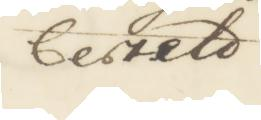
besteld
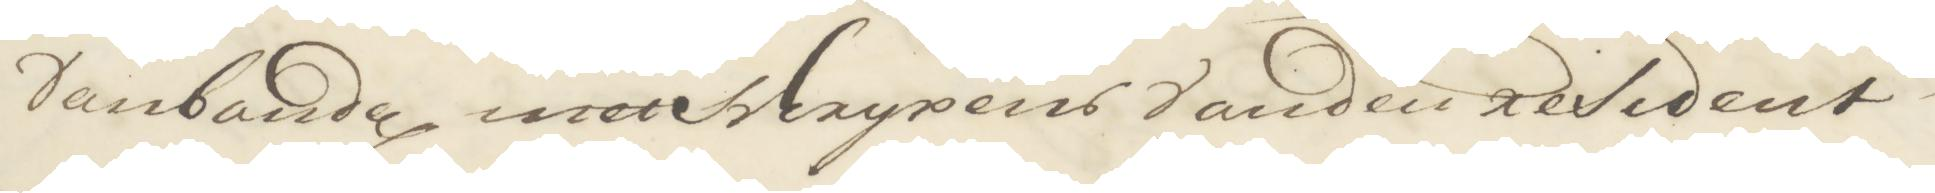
van banda met schryvens van den resident
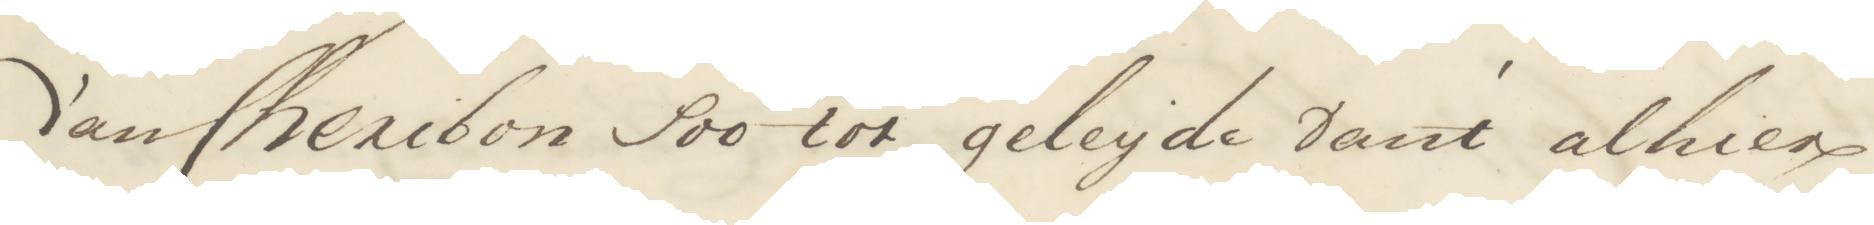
van Cheribon soo tot geleyde van 't alhier
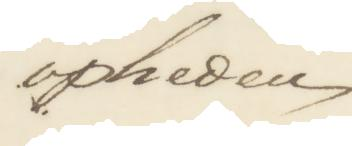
op heden
